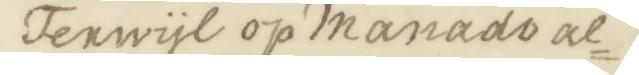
Terwijl op Manado al=
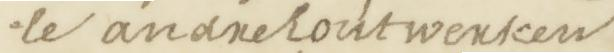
le andre houtwerken
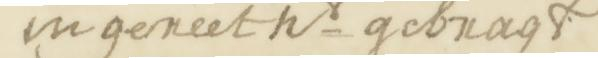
in gereet h=t gebragt
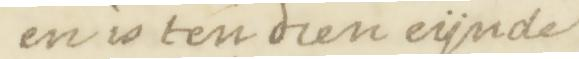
en is ten dien eijnde
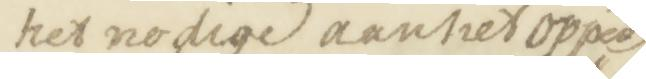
het nodige aan het opper„
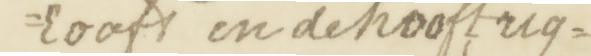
hoofd en de hooft rig=
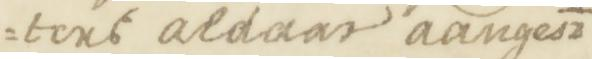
=ters aldaar aangesz
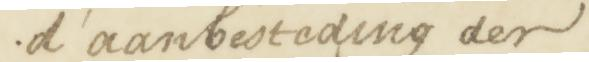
d' aanbesteding der
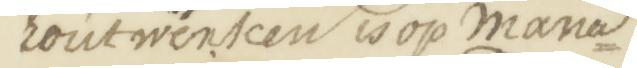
houtwerken is op mana=
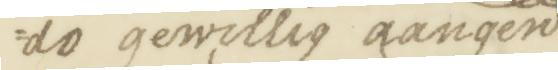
„do gewillig aangen
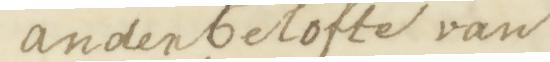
ander belofte van
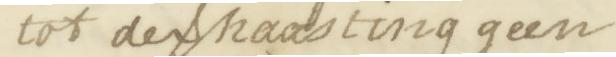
tot de verhaasting geen
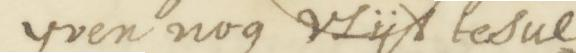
yver nog vlijt tesul
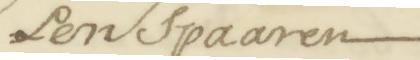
Een Spaaren
